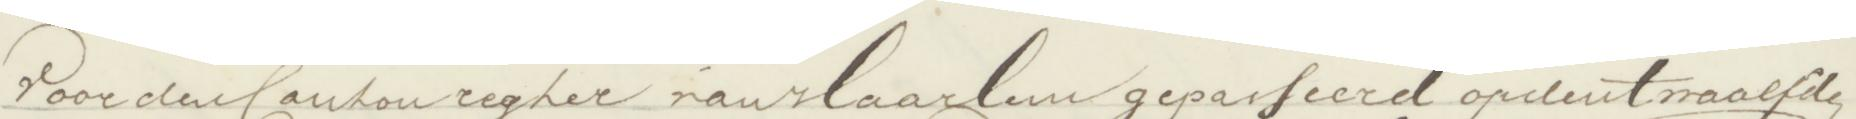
Voor den Canton regter van Haarlem gepasseerd op den twaalfden
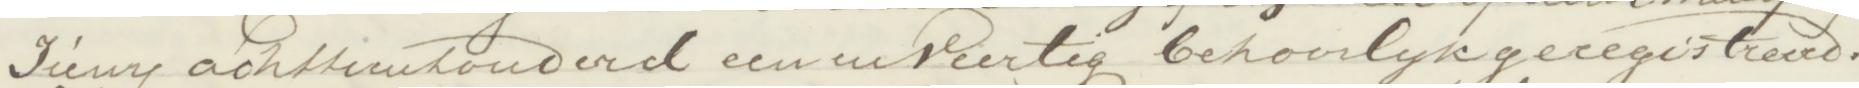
Juny achttienhonderd een en Veertig behoorlyk geregistreerd.
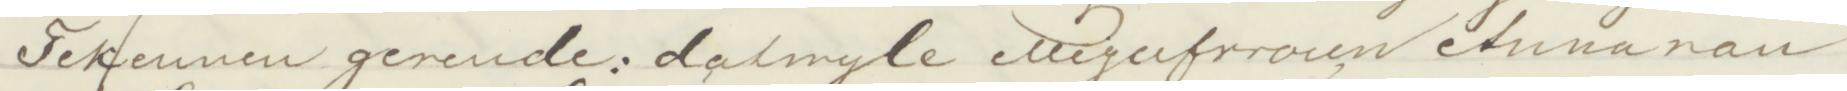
Tekennen gevende: dat wyle Mejufvrouw Anna van
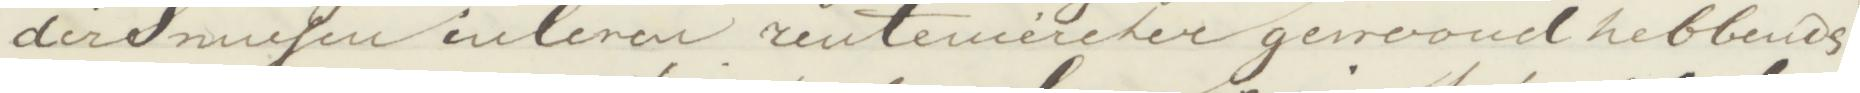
der Smissen in leven rentenierster gewoond hebbende
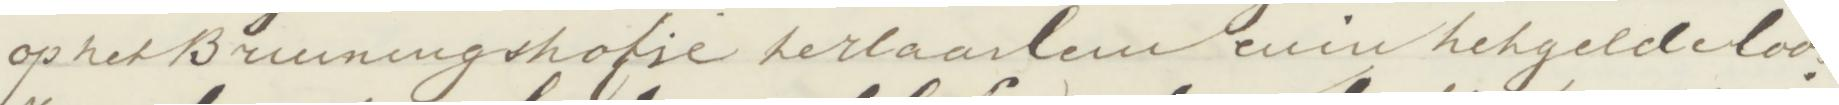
op het Bruiningshofje te Haarlem en in het geldeloo„
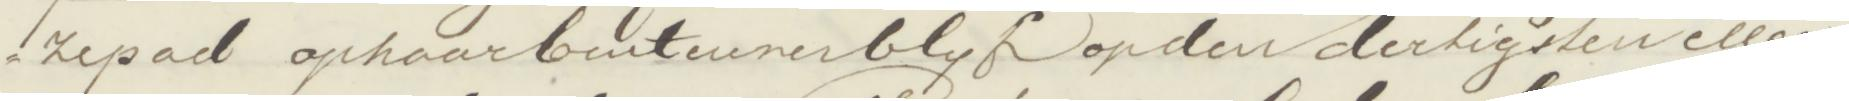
=zepad op haar buitenverblyf op den dertigsten Mei
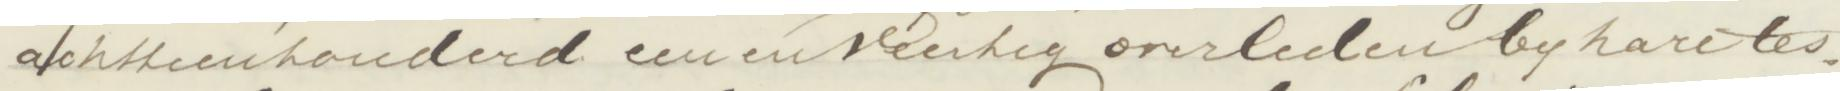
achttienhonderd een en veertig overleden by hare tes„
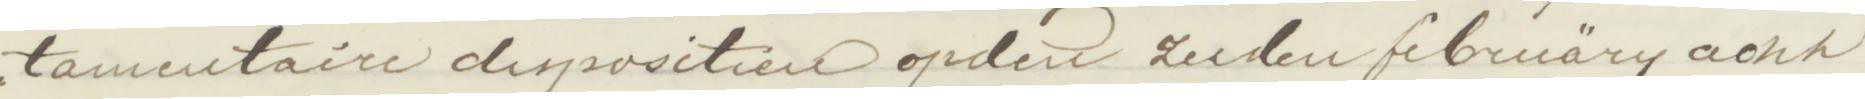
=tamentaire dispositien op den zesden februäry acht
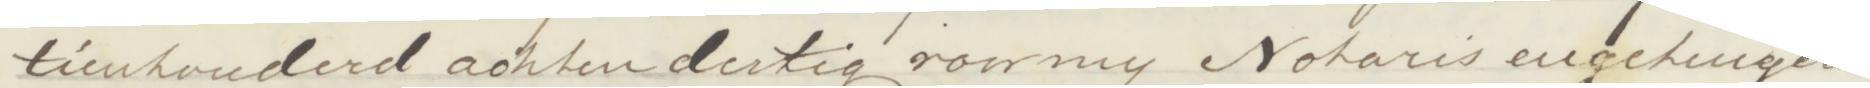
=tienhonderd acht en dertig voor my Notaris en getuigen
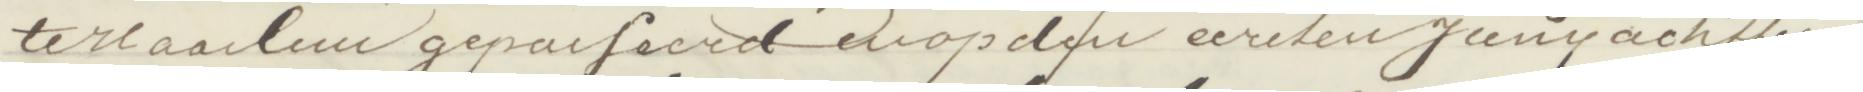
te Haarlem gepasseerd en op den eersten Juny achttien
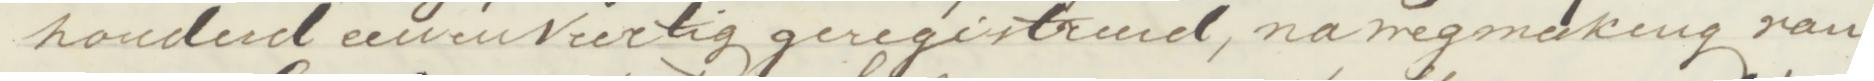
honderd een en Veertig geregistreerd, na wegmaking van
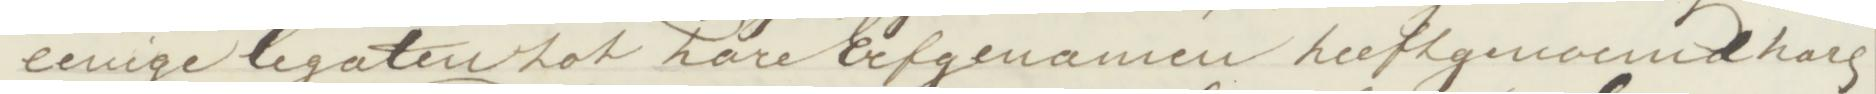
eenige legaten tot hare Erfgenamen heeft genoemd haren
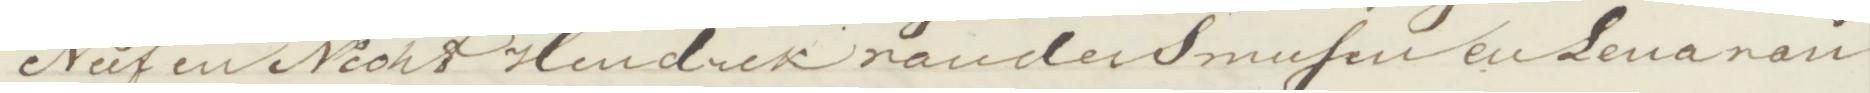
Neef en Nicht Hendrik van der Smissen en Lena van
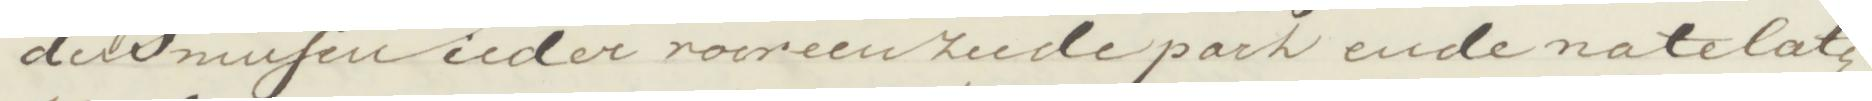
der Smissen ieder voor een zesde part ende natelaten
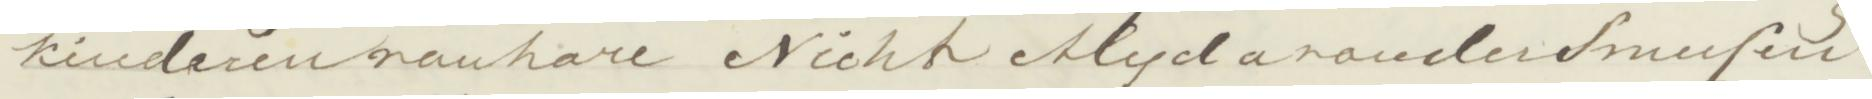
kinderen van hare Nicht Alyda van der Smissen
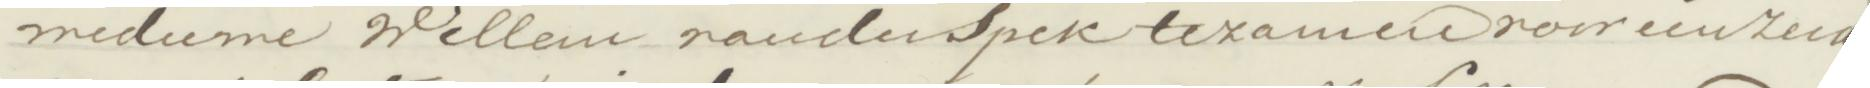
weduwe Willem van der Spek tezamen voor een zesd
